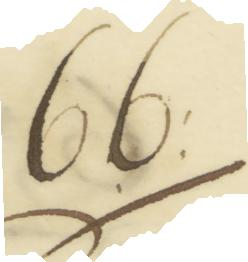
66:
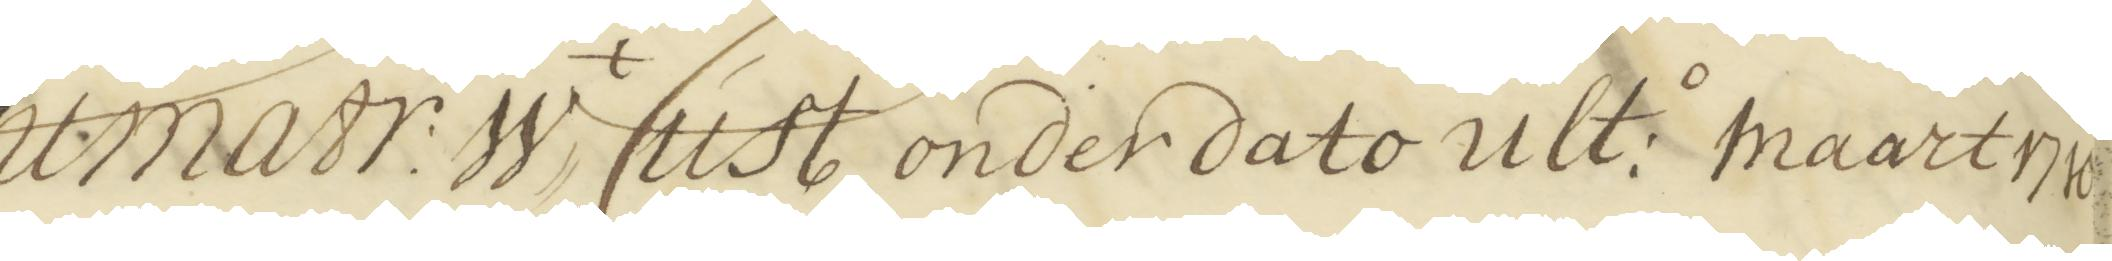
Van Sumatr:s W„t Cust, onder dato ult:o maart 1710
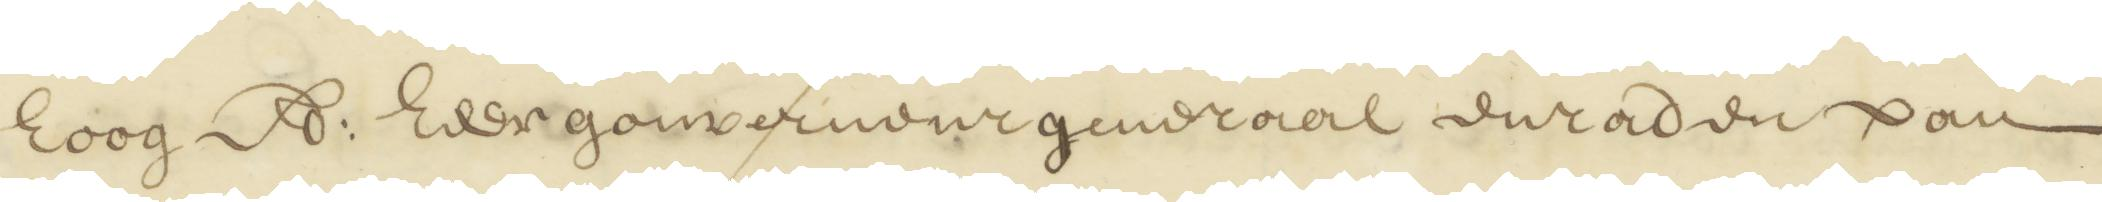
hoog Ed: heer gouverneur generaal en raden van
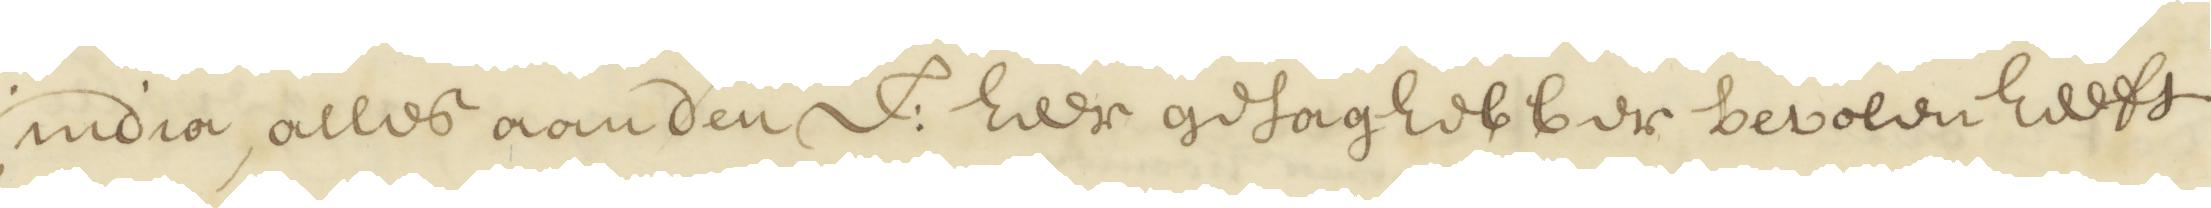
india, alles aan den E: heer gesaghebber bevolen heeft
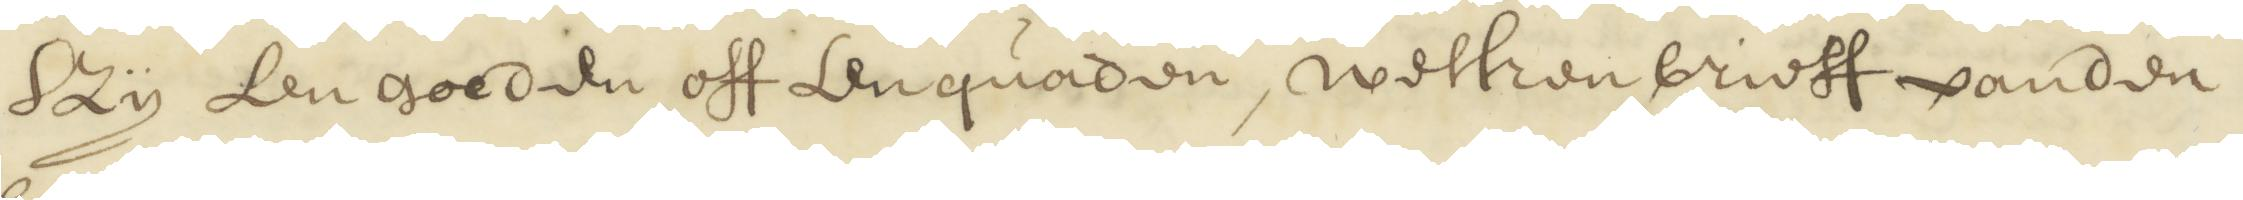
't zij ten goeden off ten quaden, welken brieff vanden
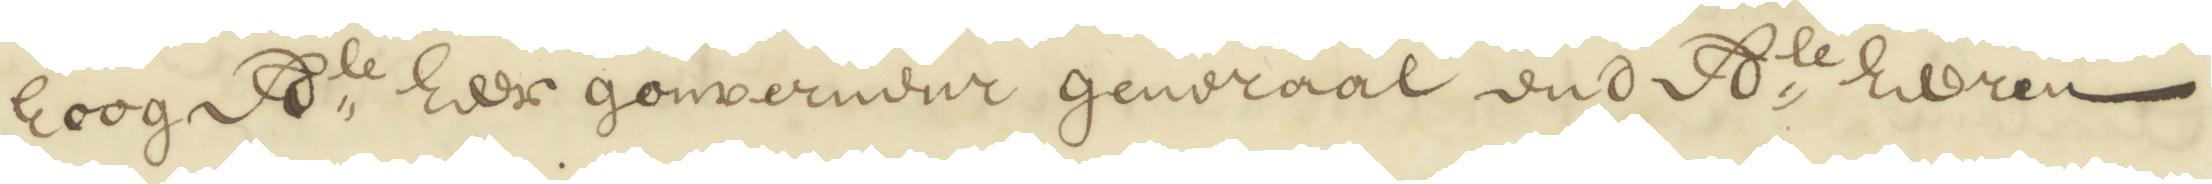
hoog Ed„le heer gouverneur generaal en d Ed„le heeren
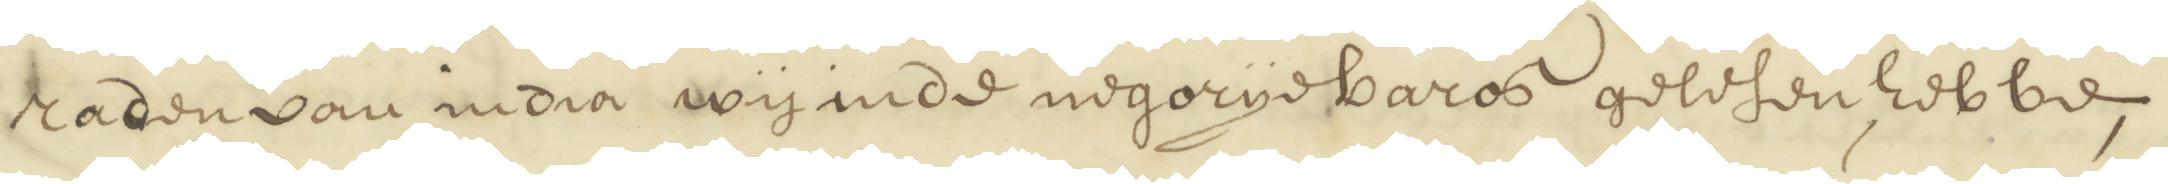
raden van india wij inde negorije baros gelesen hebbe,
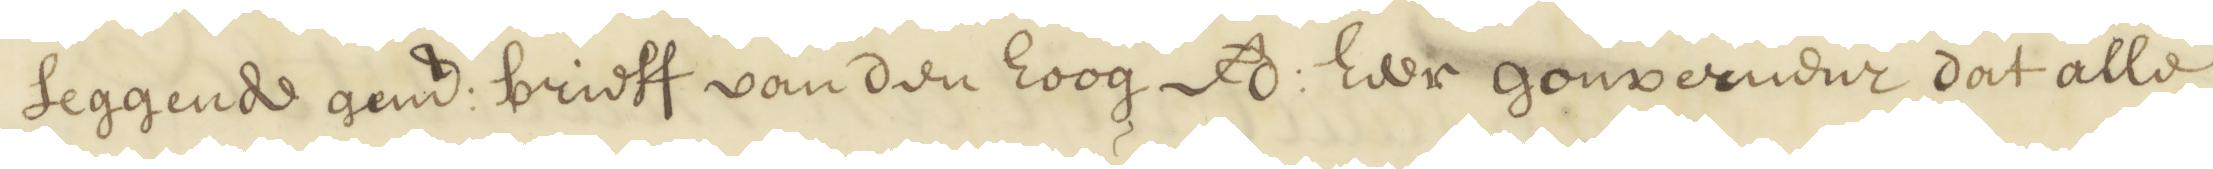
seggende gem: brieff van den hoog Ed: heer gouverneur dat alle
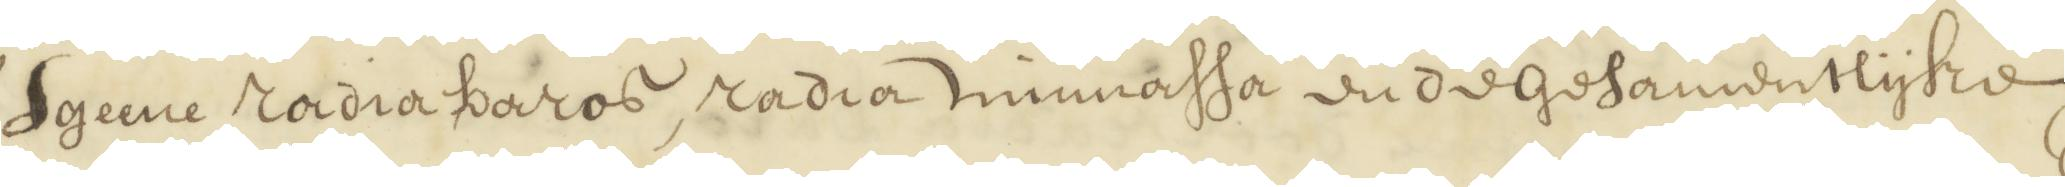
’t geene radia baros, radia minuassa en de gesamentlijke
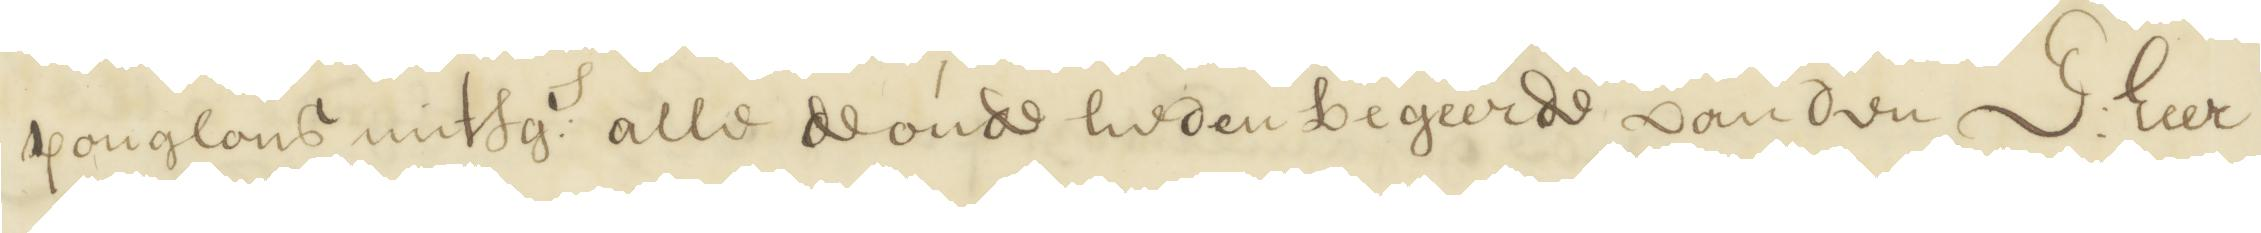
ponglons mitsg:s alle de oude leden begeerde van den E: heer
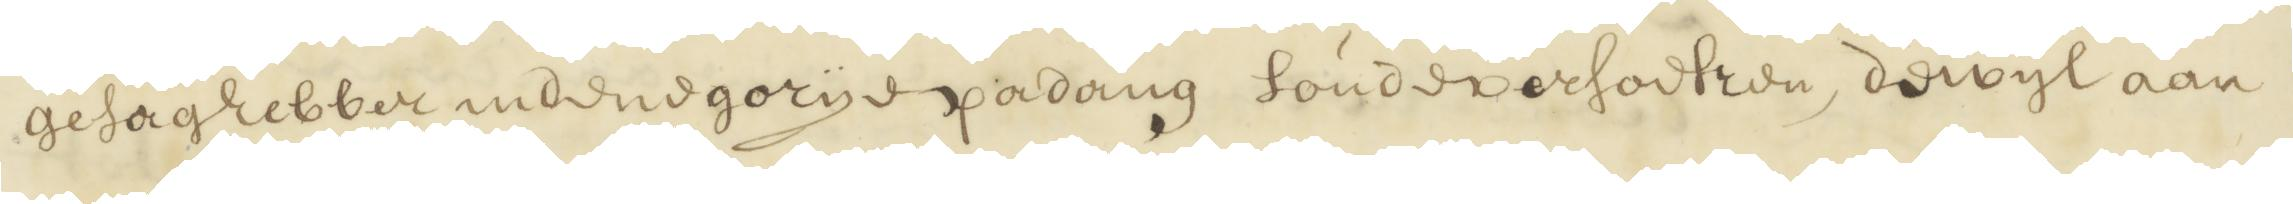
gesaghebber in de negorije padang soude versoeken, dewijl aan
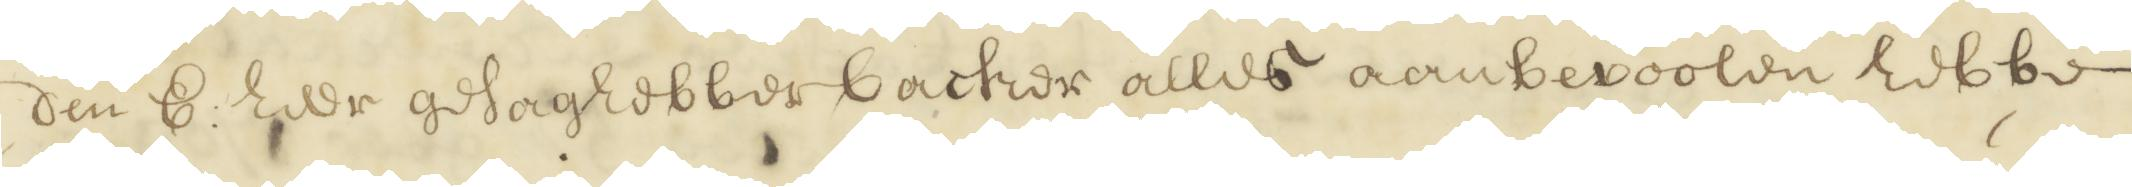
den E: heer gesaghebber backer alles aanbevoolen hebbe
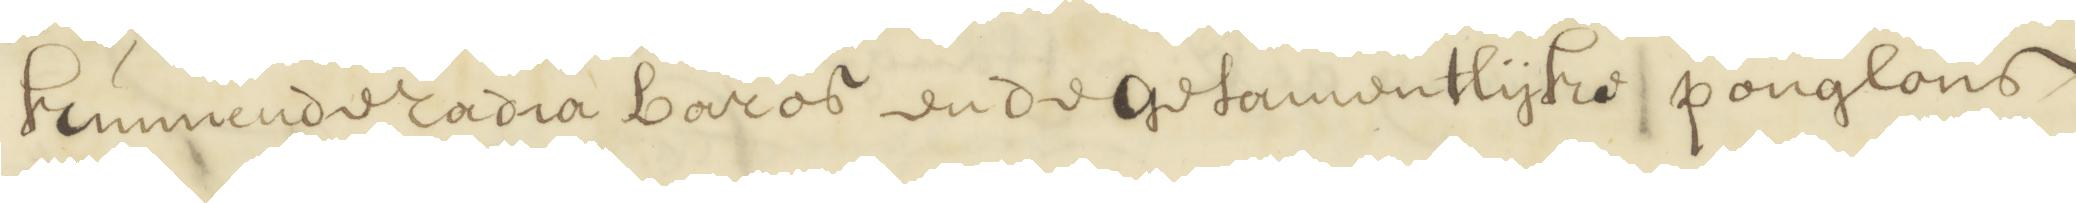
kunnende radia baros en de gesamentlijke ponglous
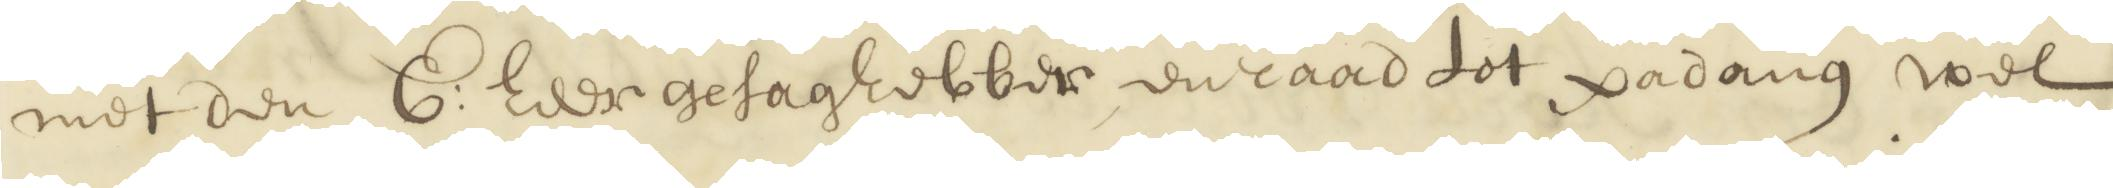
met den E: Heer gesaghebber en raad tot padang wel
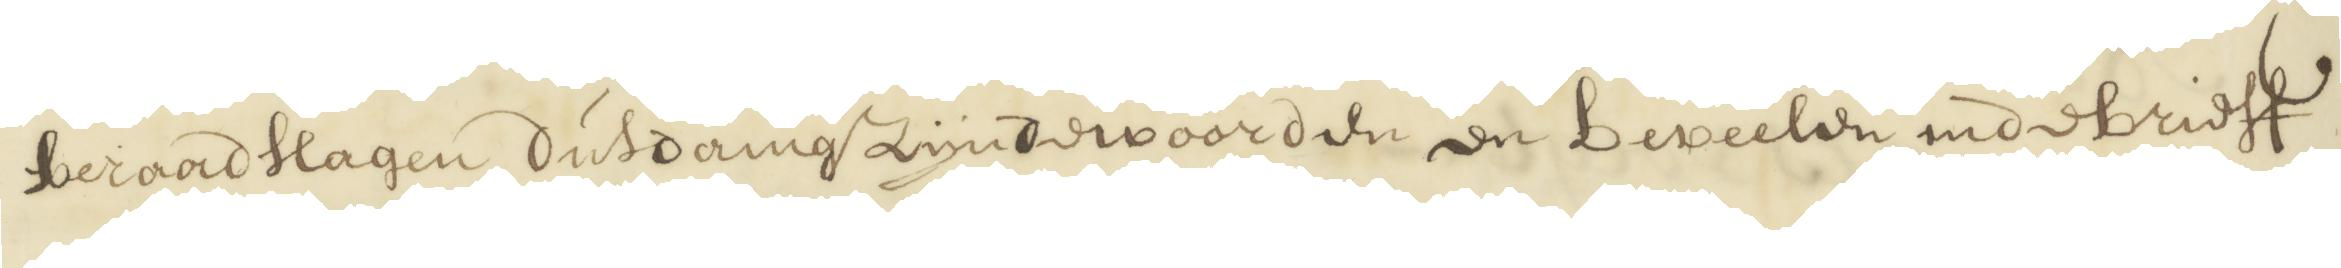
beraadslagen, dusdanig zijn de woorden en beveelen in de brieff
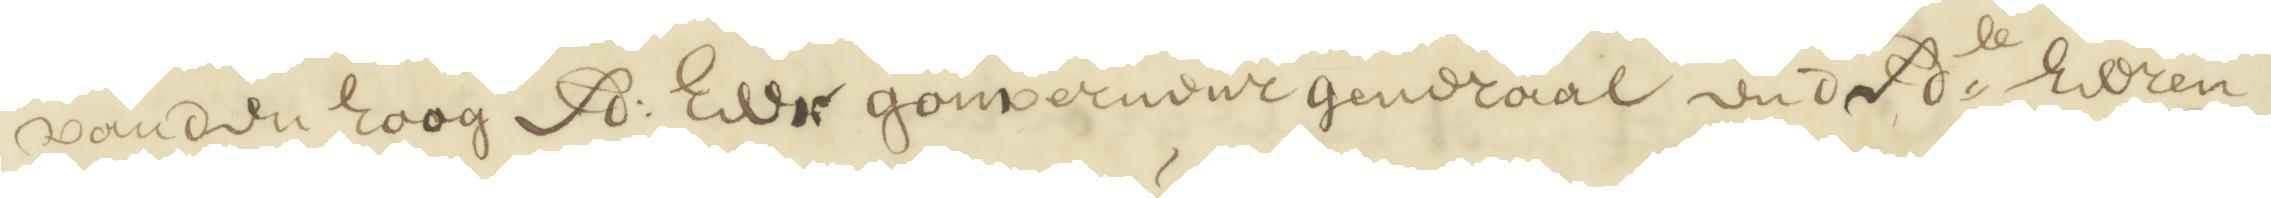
van den hoog Ed: heer gouverneur generaal en d'Ed„le heeren
